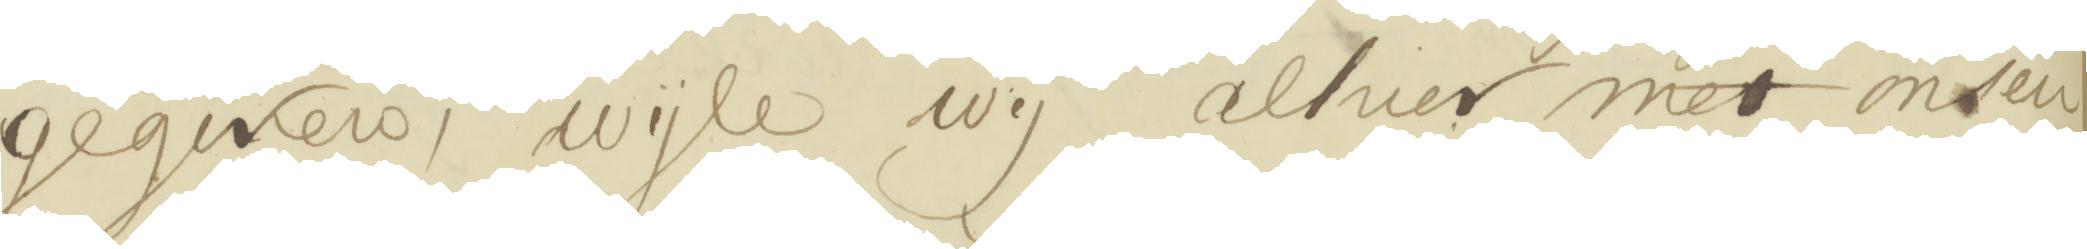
gegeven, wijle wij alhier met onsen
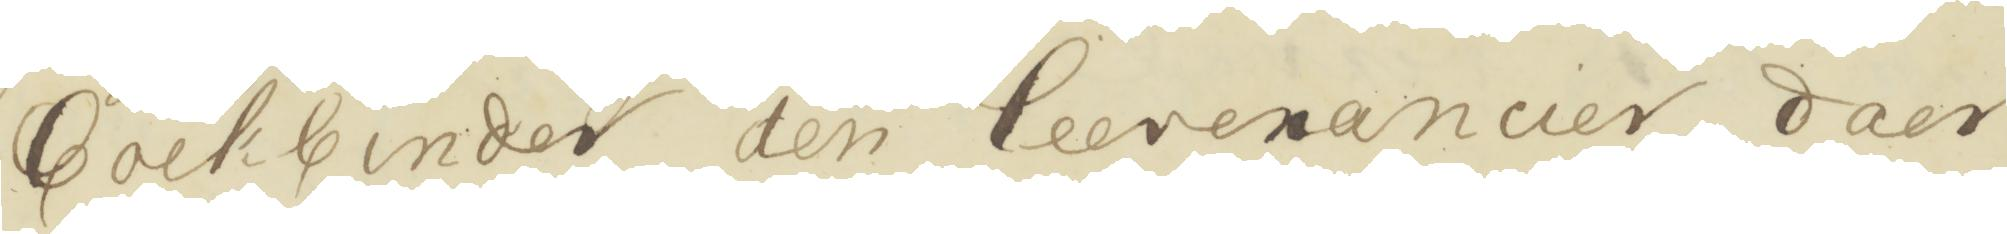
boekbinder den leeverancier daer
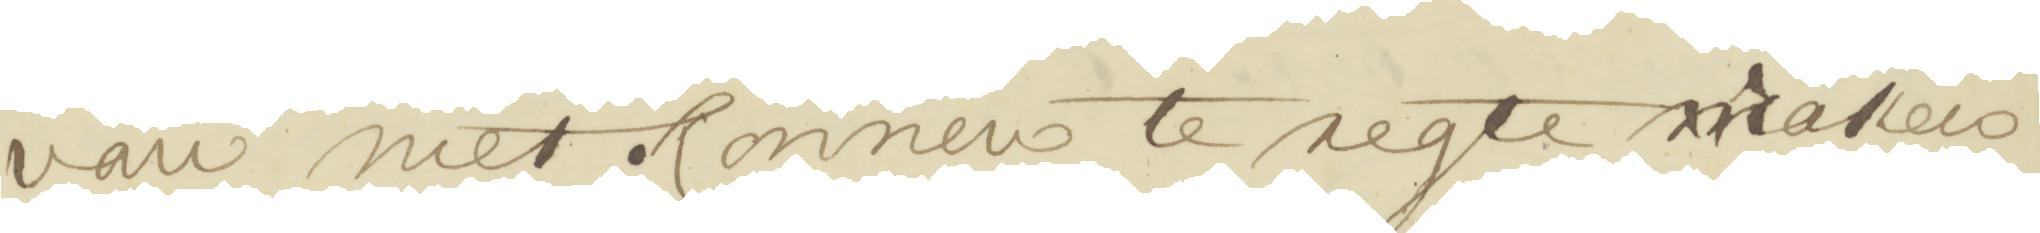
van niet konnen te regte mraken
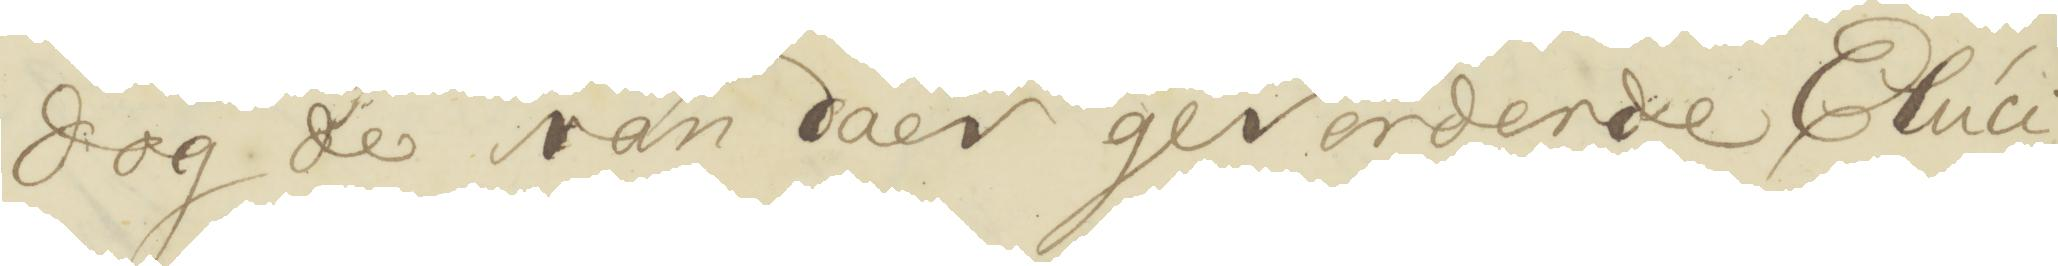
dog de van daer gevorderde Eluci
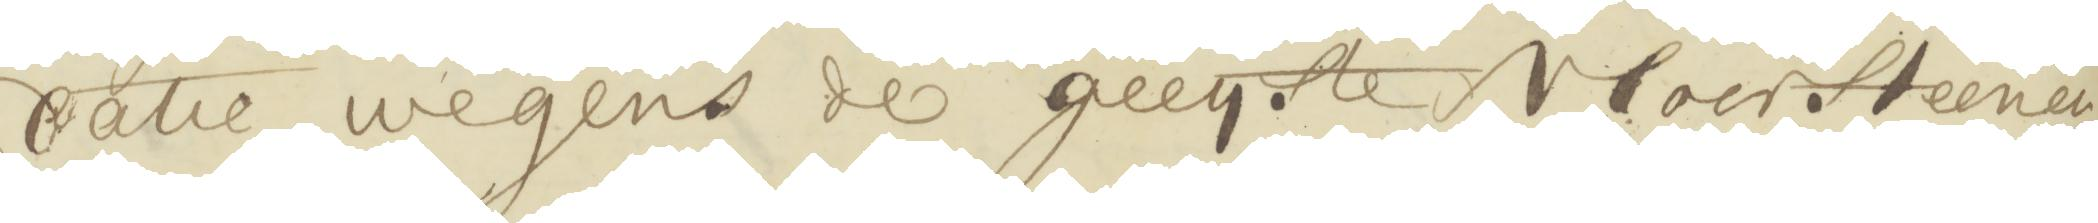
datie wegens de geeyste vloersteenen
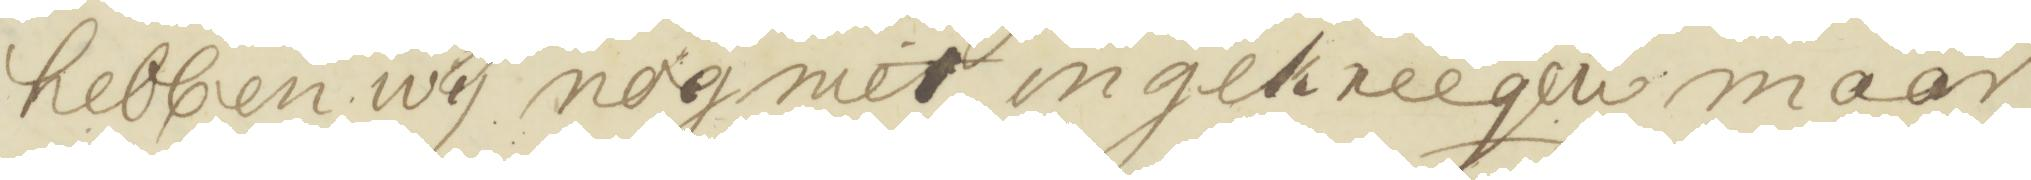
hebben wy nog niet in gekreegen maar
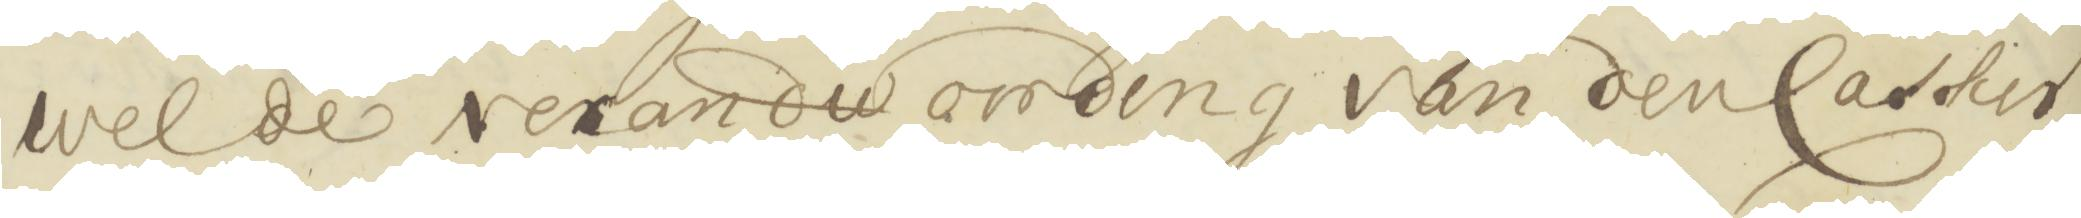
wel de verandw oording van denCassier
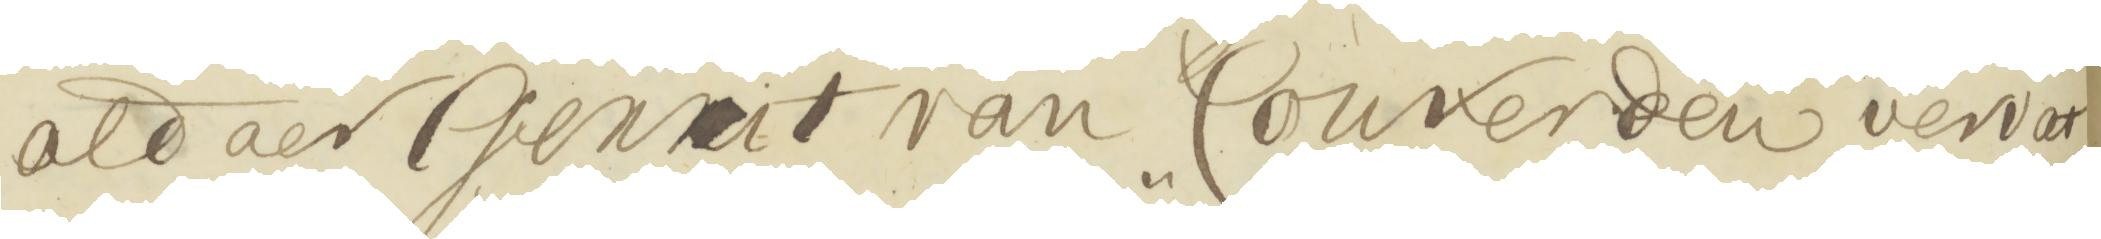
aldaer Gerrit van Couverden vervat
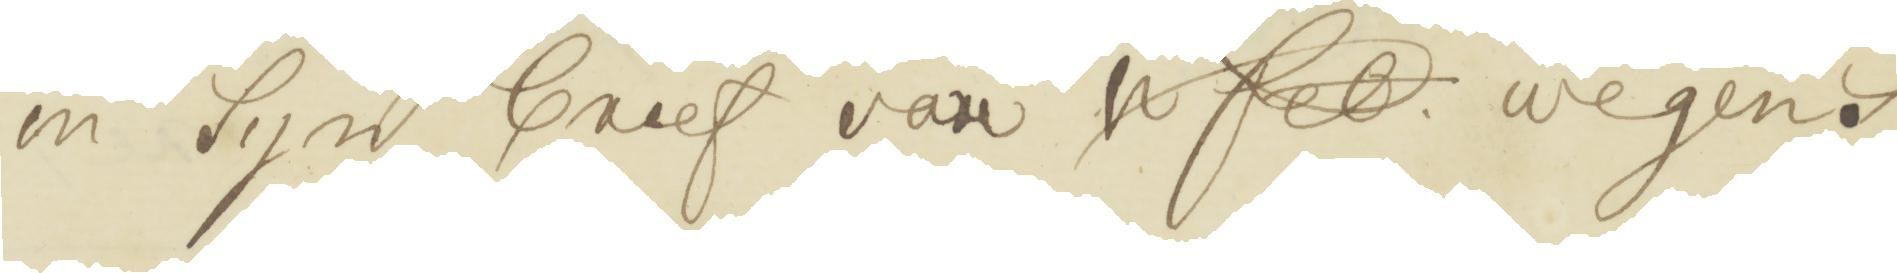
in syn brief van 10n feb. wegens
